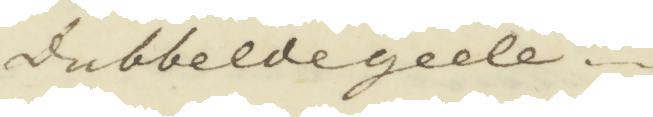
Dubbelde geele
